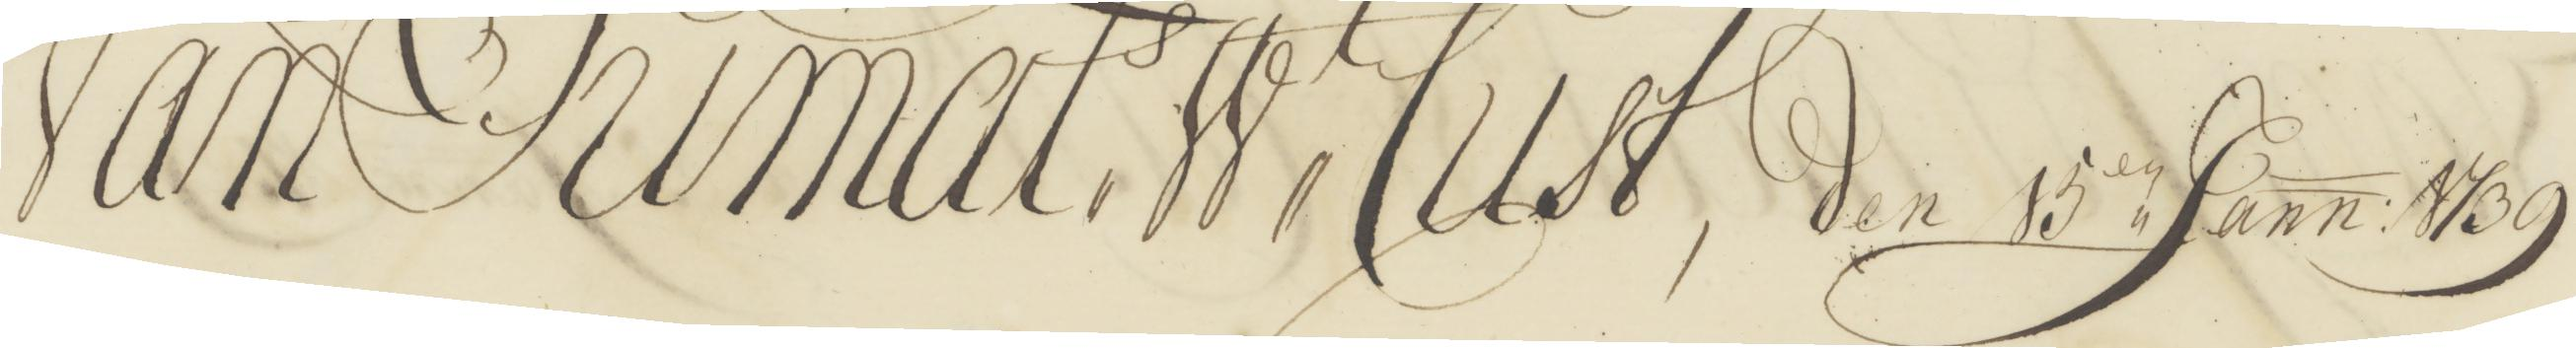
Van Sumat„s W„t Cust, den 15„en Jann: 1739
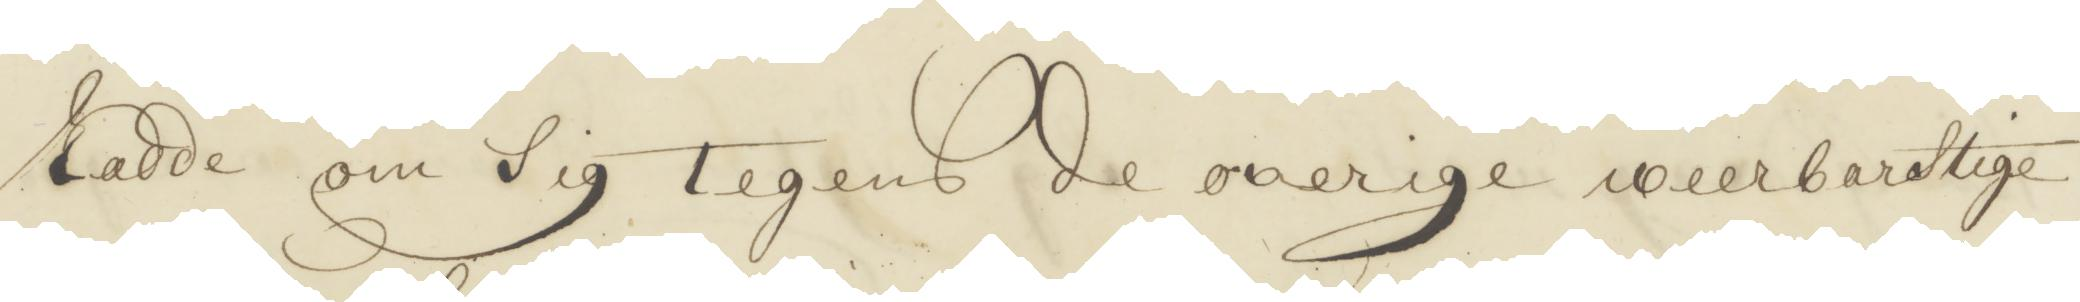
hadde om sig tegens de overige weerbarstige
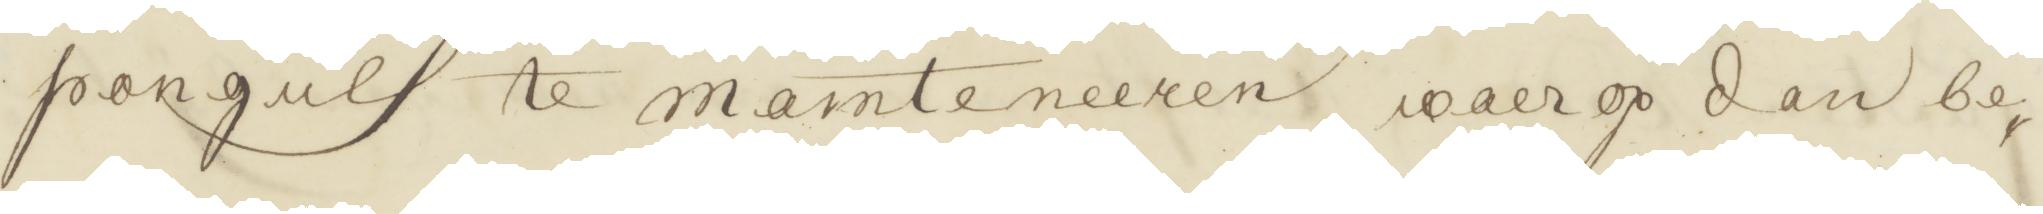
ponguls te mainteneeren, waer op dan be„
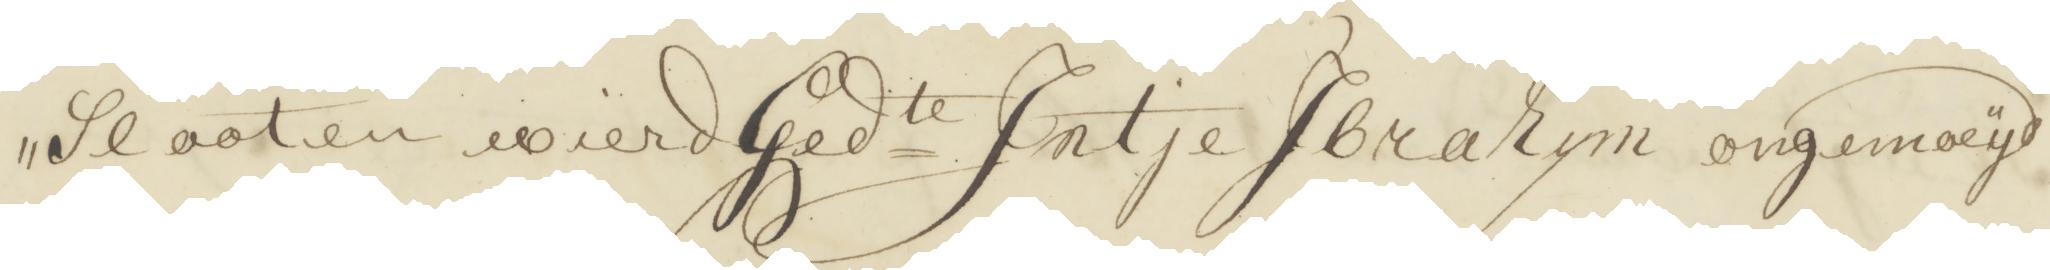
„slooten wierd Ged=te Intje Ibrahijm ongemoeijd
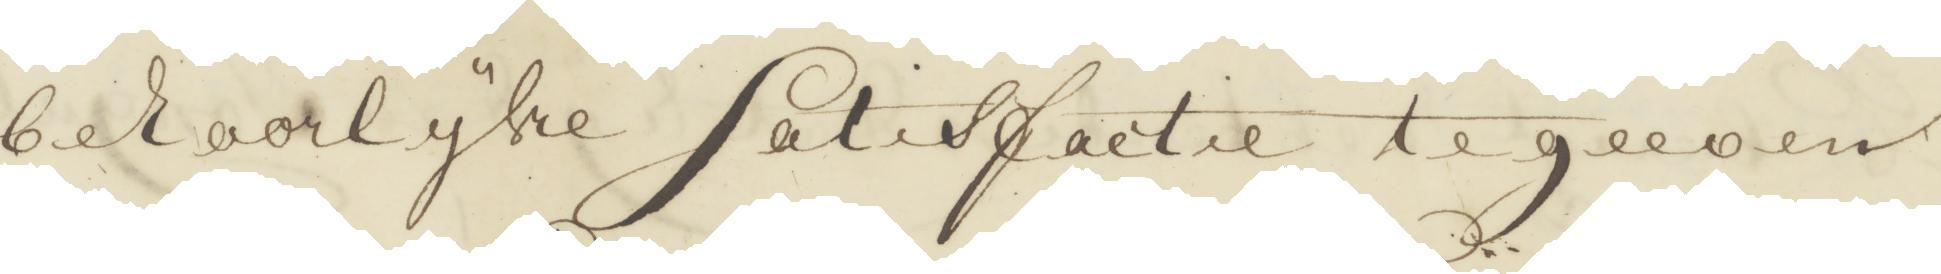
behoorlijke satisfactie te geeven
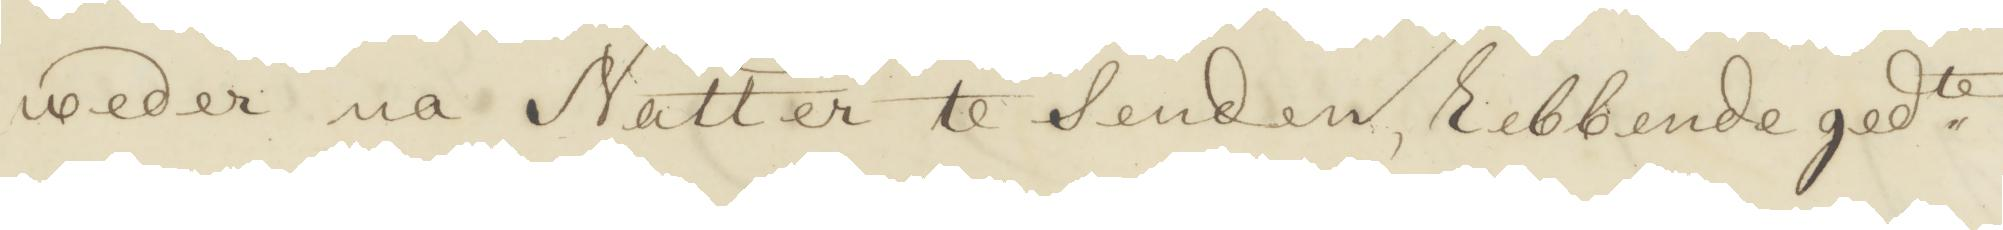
weder na Natter te senden, hebbende ged„te
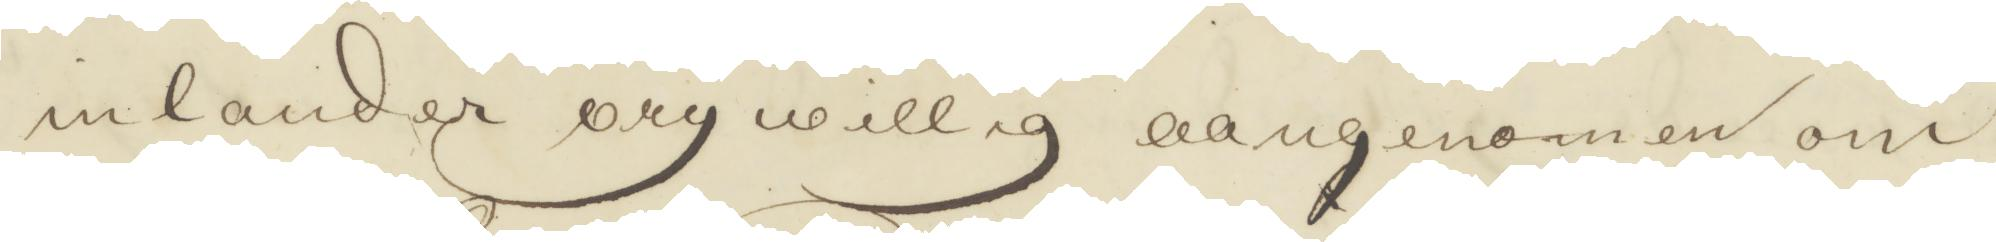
inlander vrij willig aangenomen om
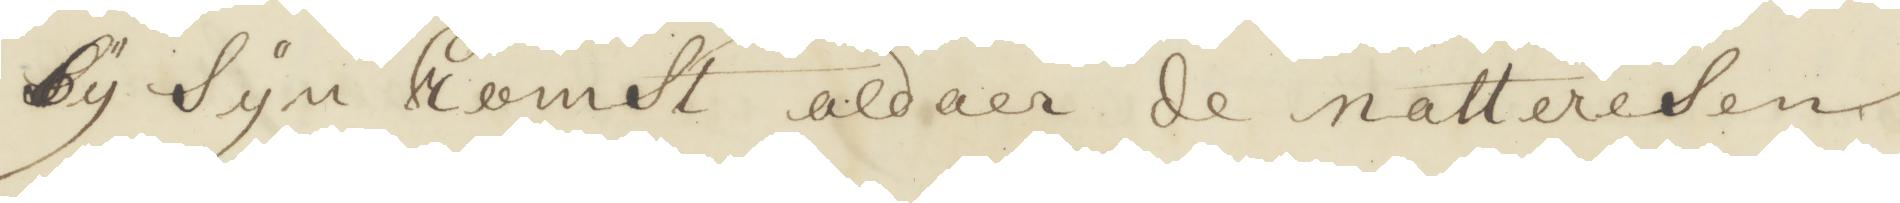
bij sijn komst aldaer de natteresen
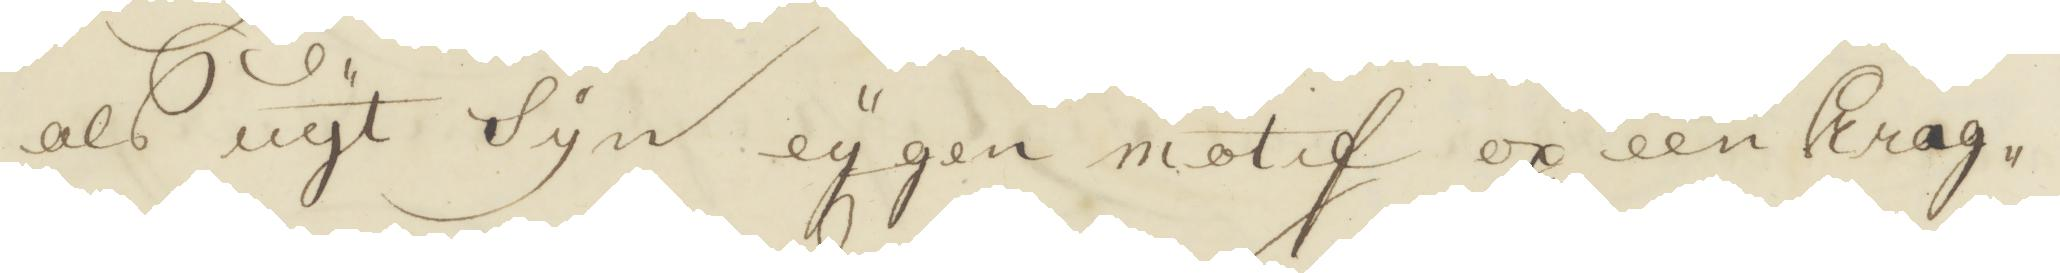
als uijt sijn eijgen motif op een krag„
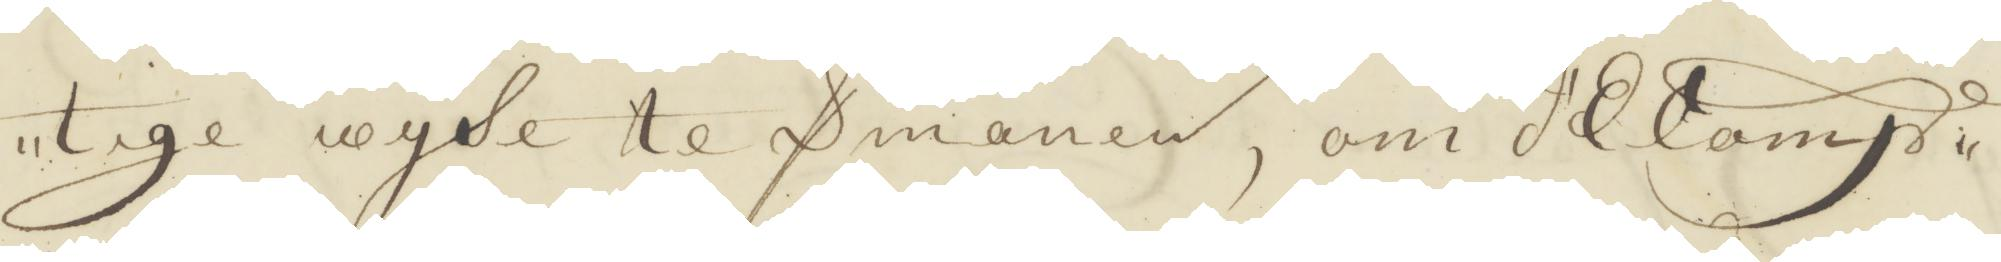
tige wijse te vermanen, om d'E Comp„e
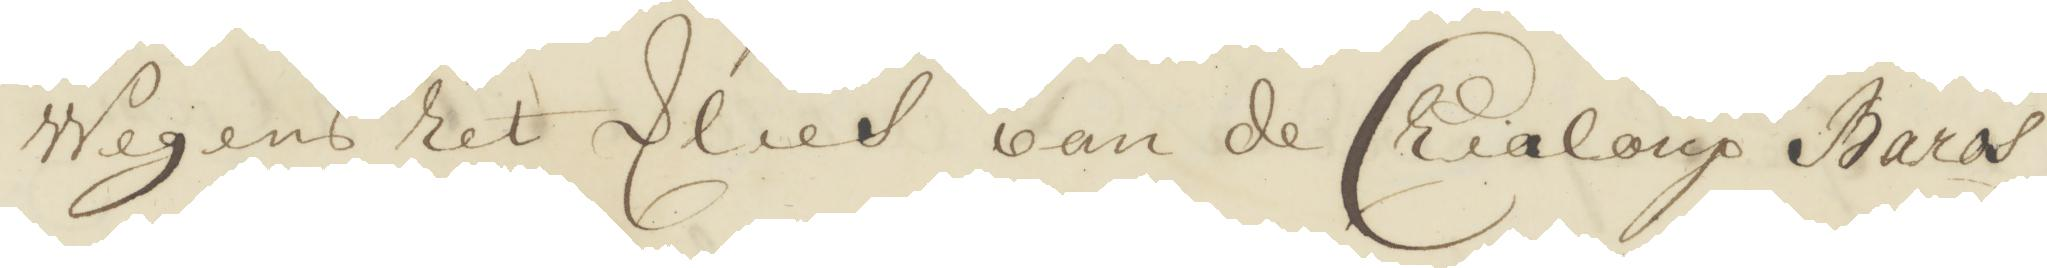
wegens het verlies van de Chialoup Baros
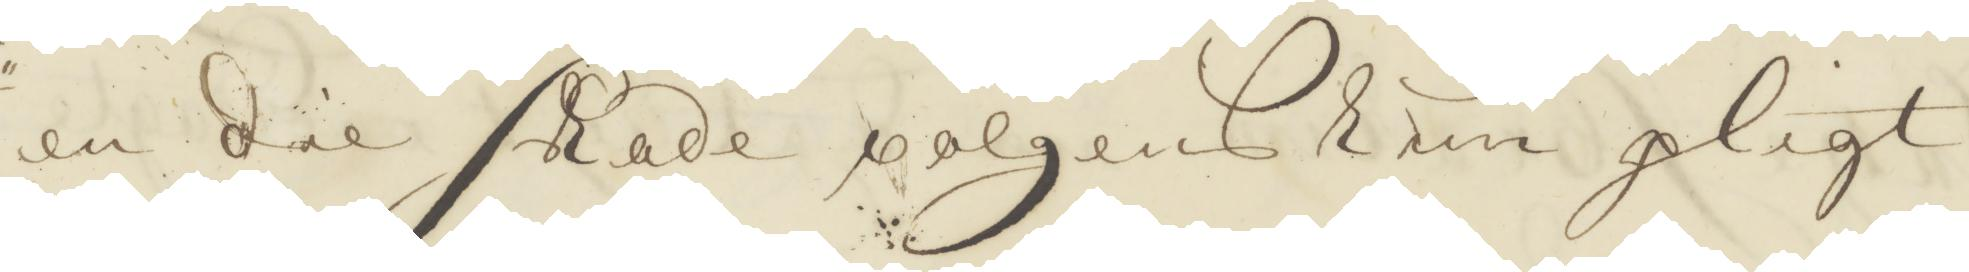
en die schade volgens hun pligt
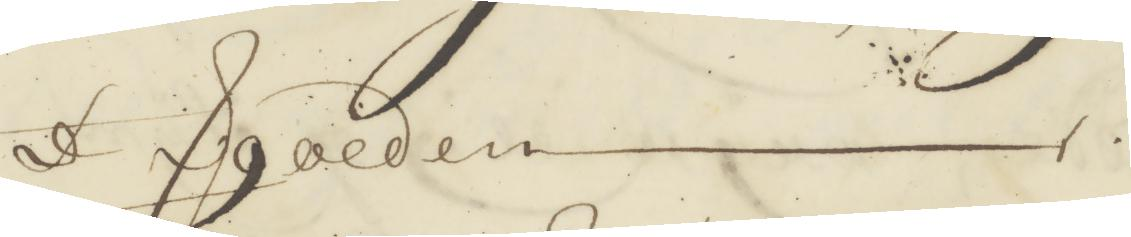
te vergoeden, .
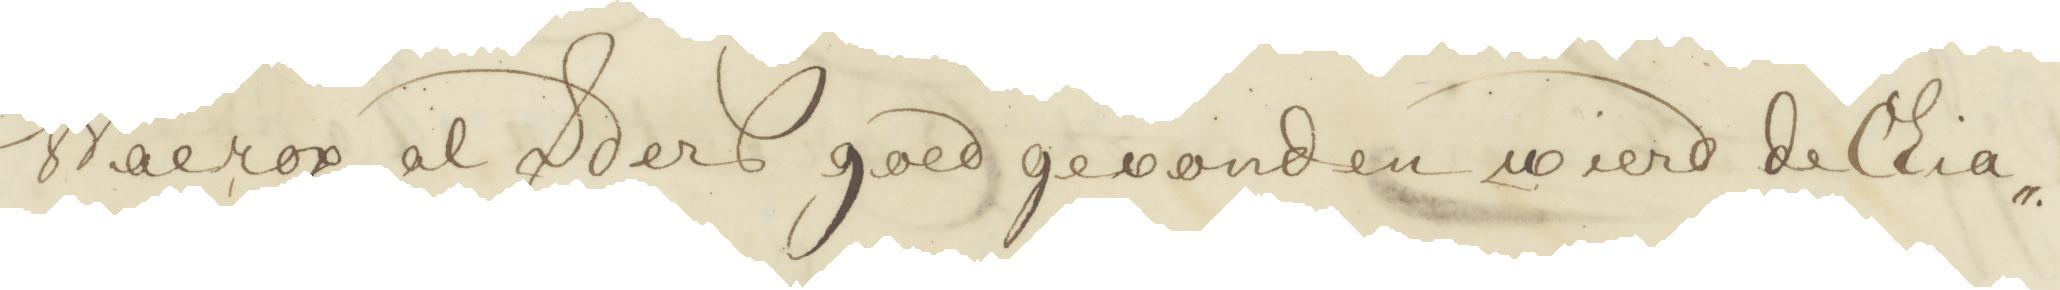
Waerop al verders goed gevonden wierd de Chia„
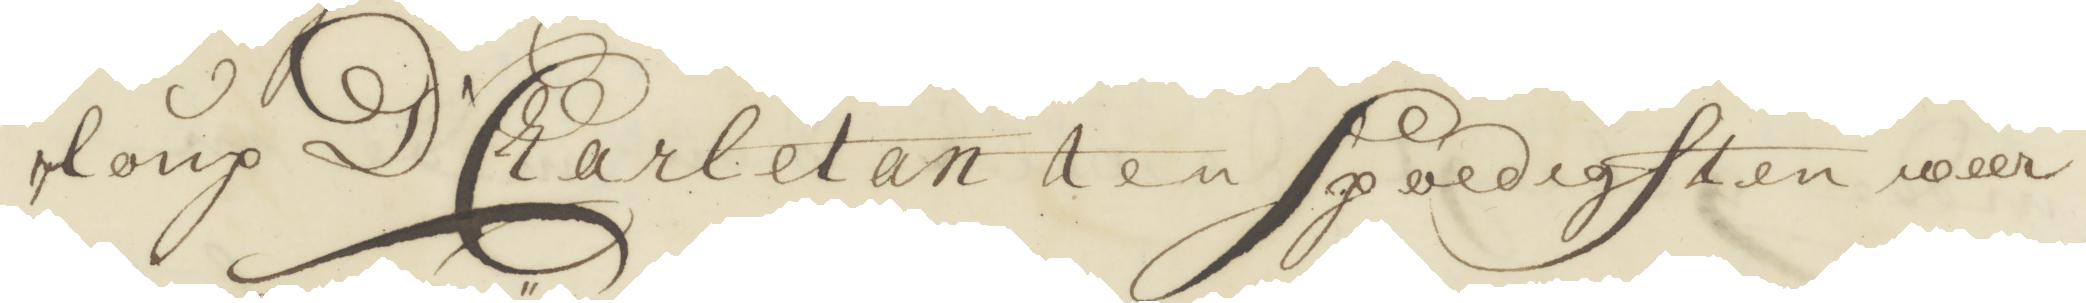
loup D'Charletan ten spoedigsten weer
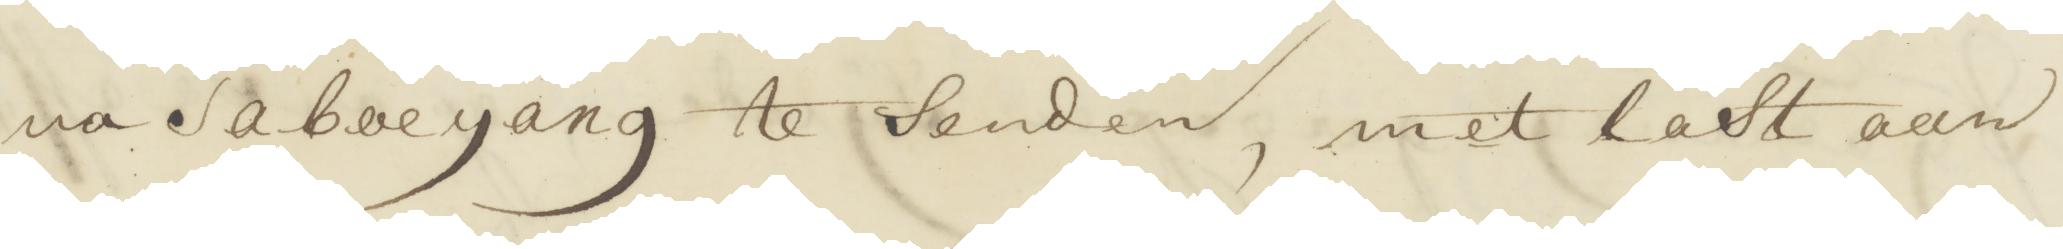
na Saboeijang te senden, met last aan
